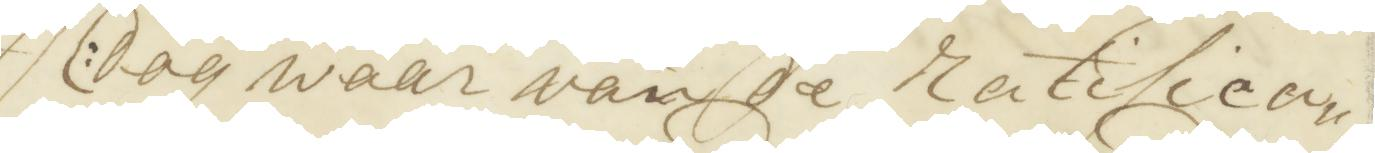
(:dog waar van de ratifica
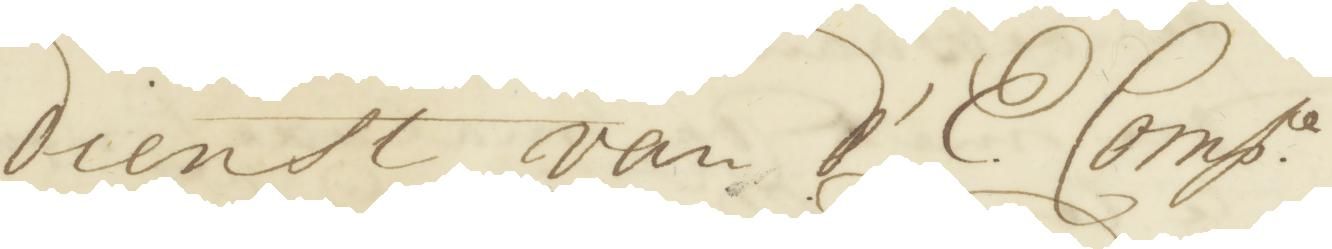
dienst van d’E Comp.e
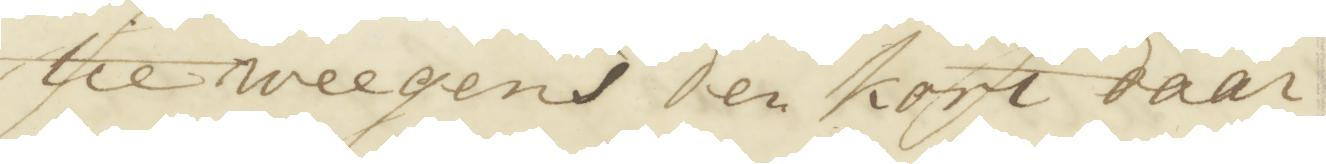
tie weegens den kort daar
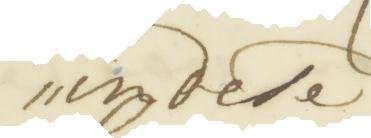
„in dese
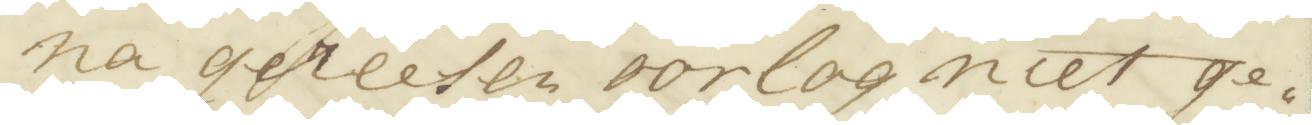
na gereesen oorlog niet ge„
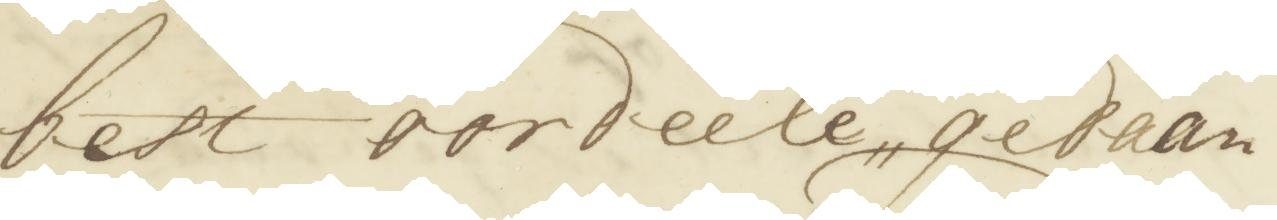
best oordeele „ gedaan
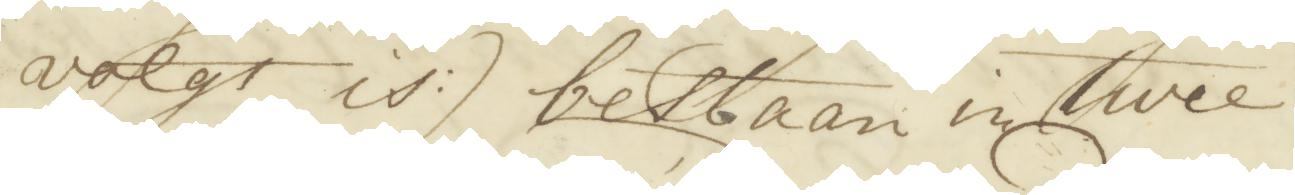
volgt is:) bestaan in twee
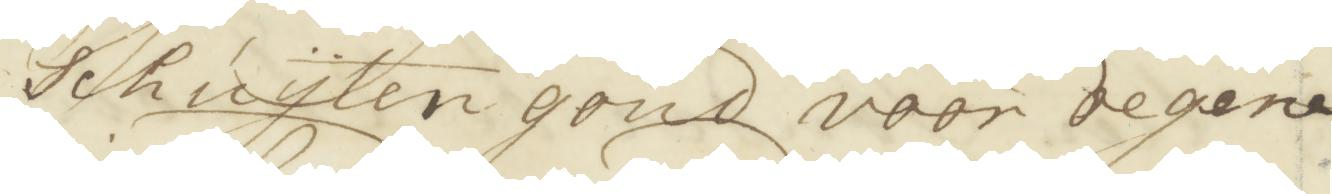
schuijten goud voor de gene
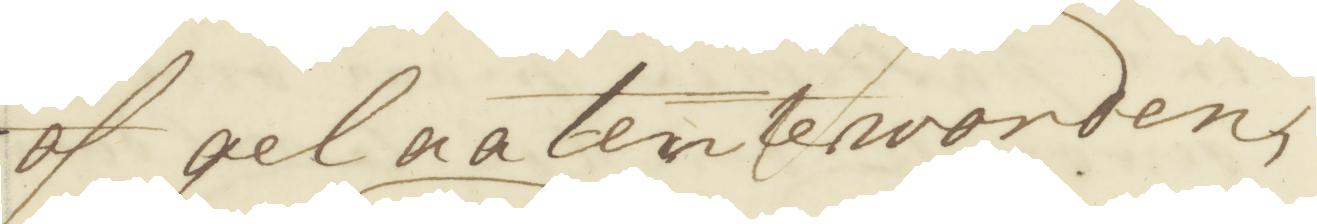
of gelaaten te worden,
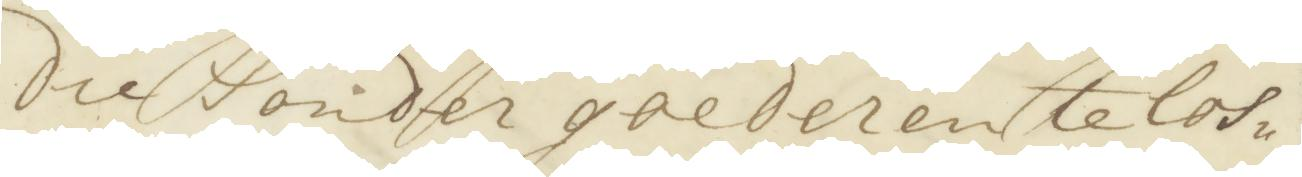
die sonder goederen te los„
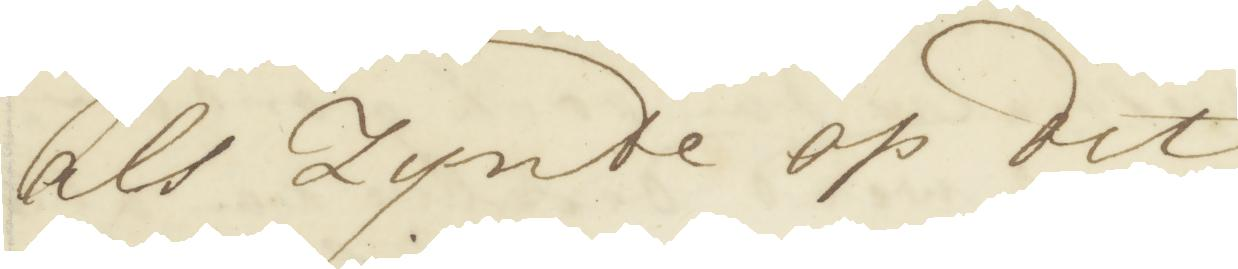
als zynde op dit
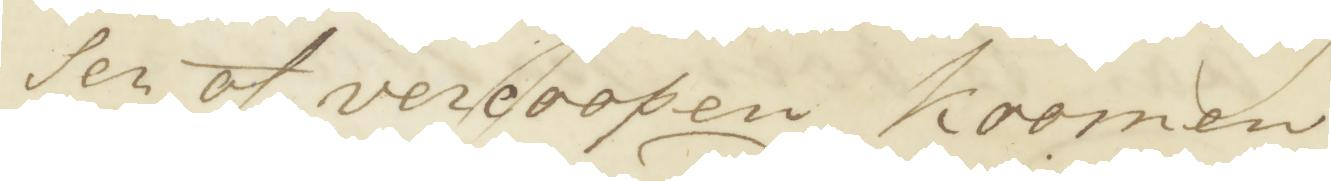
sen of vercoopen koomen
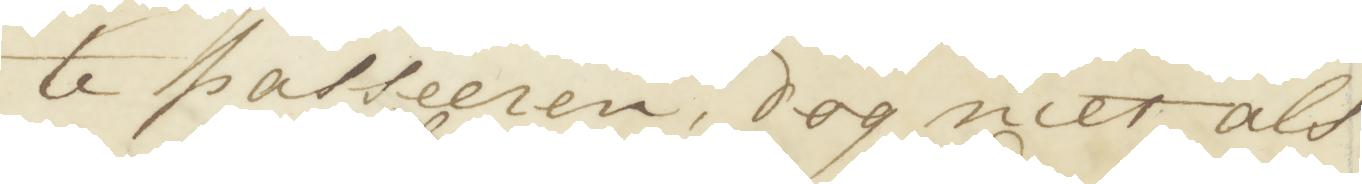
te passeeren, dog niet als
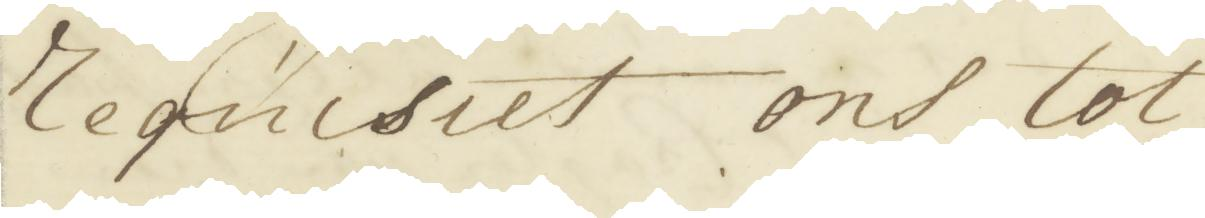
requisiet ons tot
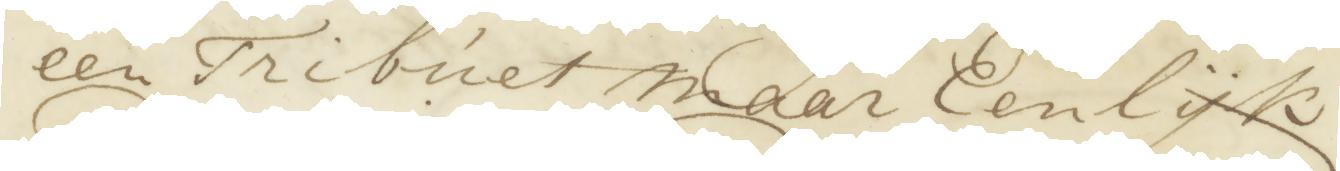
een Tribuet maar Eenlijk
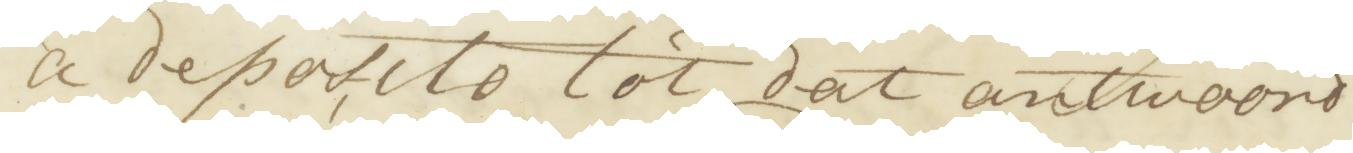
a deposito tot dat antwoord
